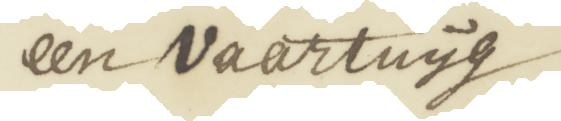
een vaartuijg
